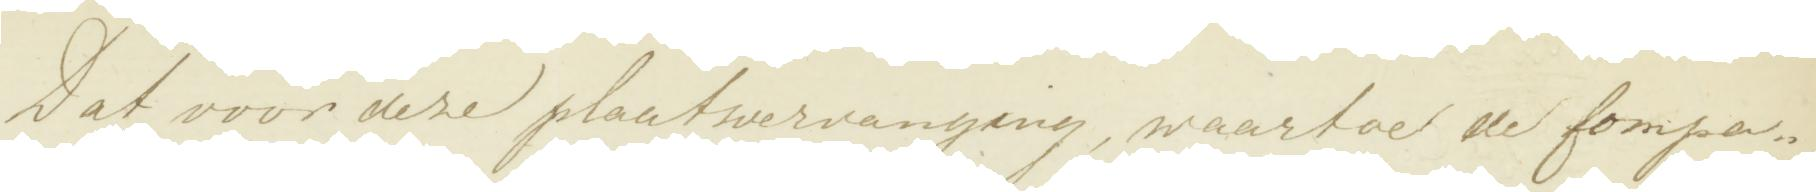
Dat voor deze plaatsvervanging, waartoe de Compa„
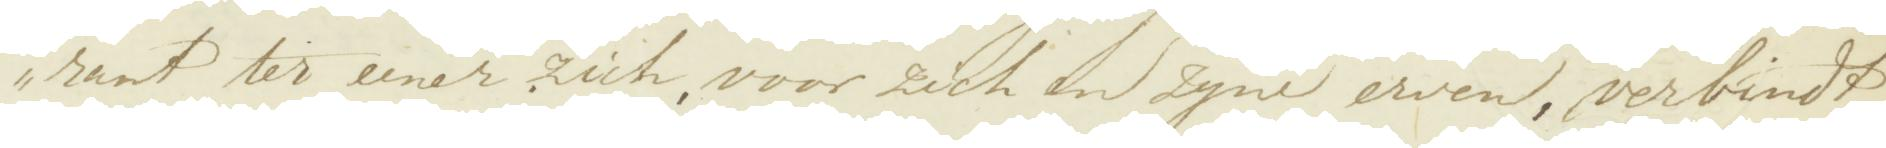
„rant ter eener zich, voor zich en zyne erven, verbindt,
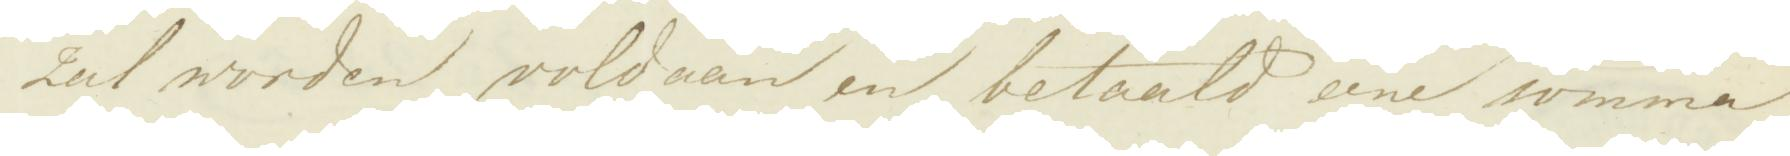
zal worden voldaan en betaald eene somma
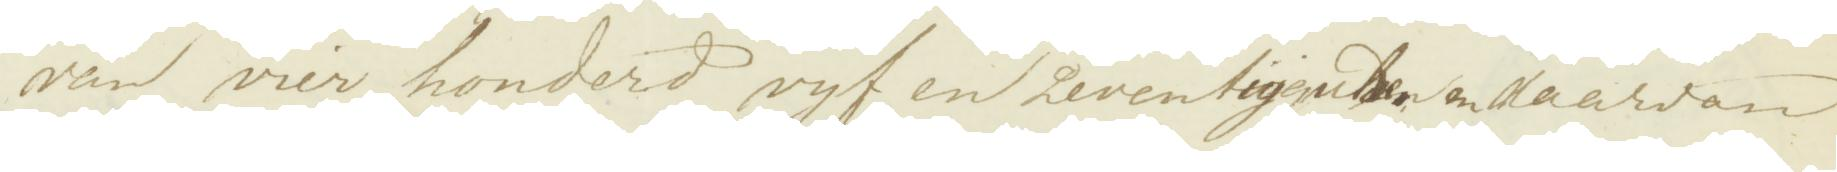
van vier honderd vyf en zeventig gulden en daarvan
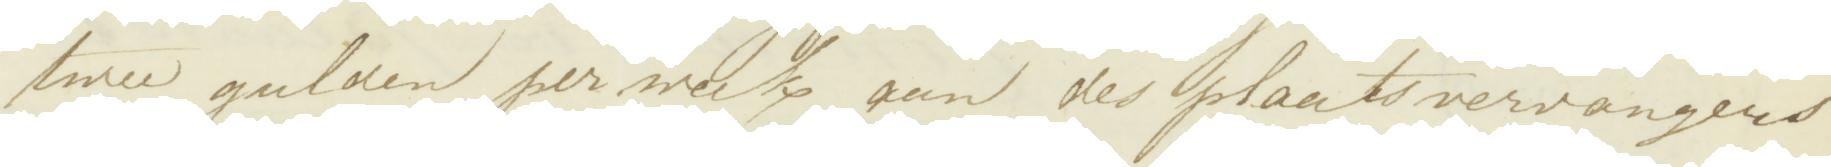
twee gulden per week aan des plaats vervangers
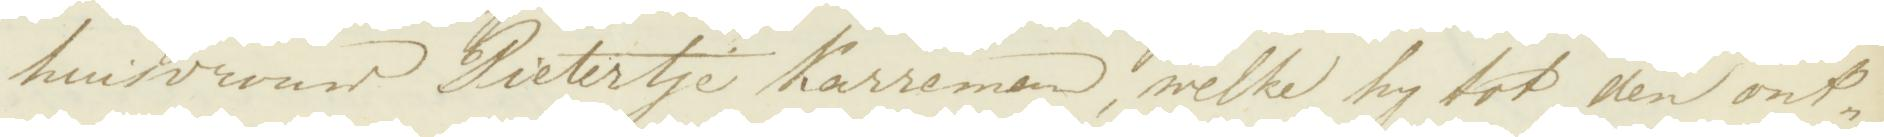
huisvrouw Pietertje Karreman, welke hy tot den ont„
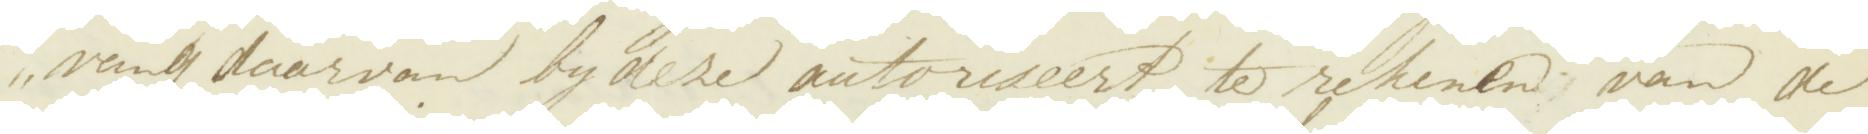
„vang daarvan by deze autoriseert, te rekenen: van de
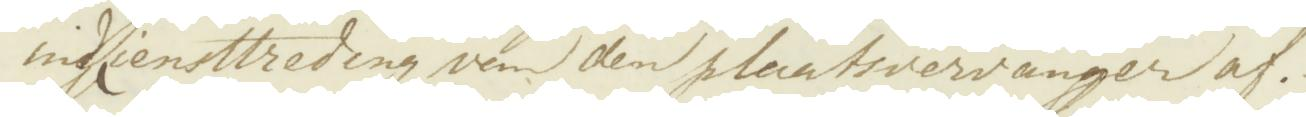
indiensttreding van den plaatsvervanger af.
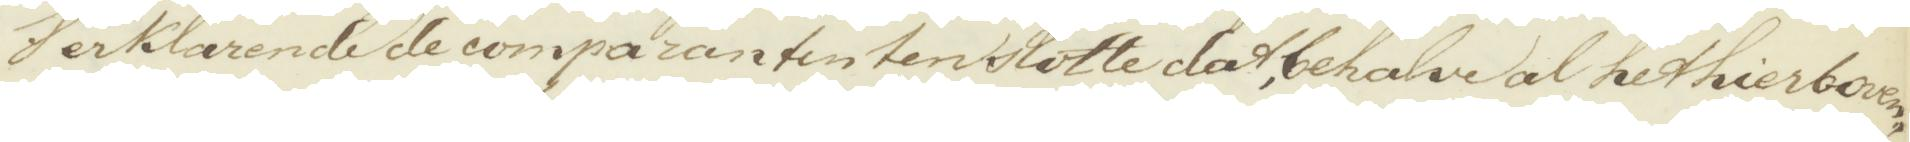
Verklarende de comparanten ten slotte dat, behave al het hier boven
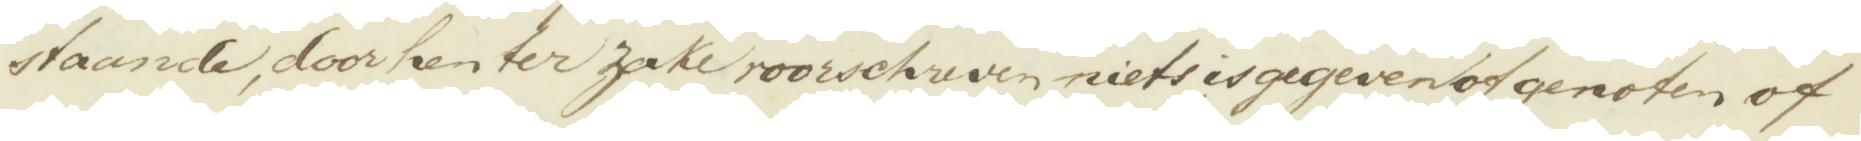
staande, door hen ter zake voorschreven niets is gegeven of genoten of
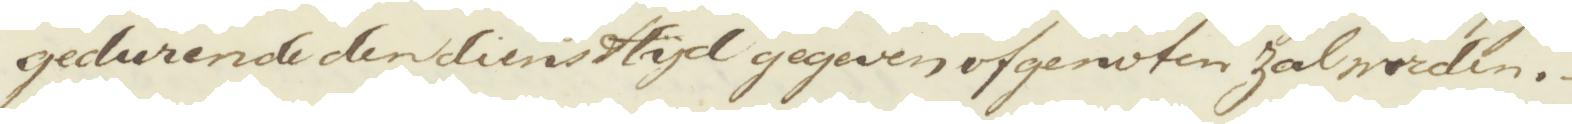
gedurende den diensttijd gegeven of genoten zal worden.
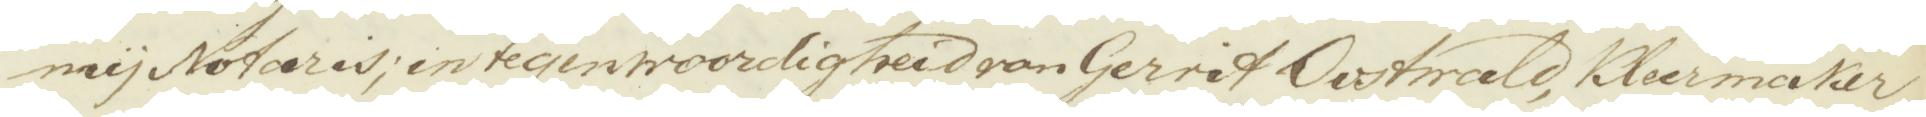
mij Notaris, in tegenwoordigheid van Gerrit Oostwald, Kleermaker
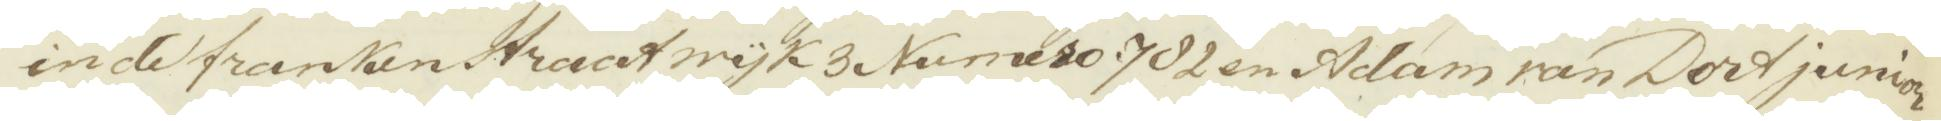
in de frankenstraat wijk 3 Numero 782 en Adam van Dort junior
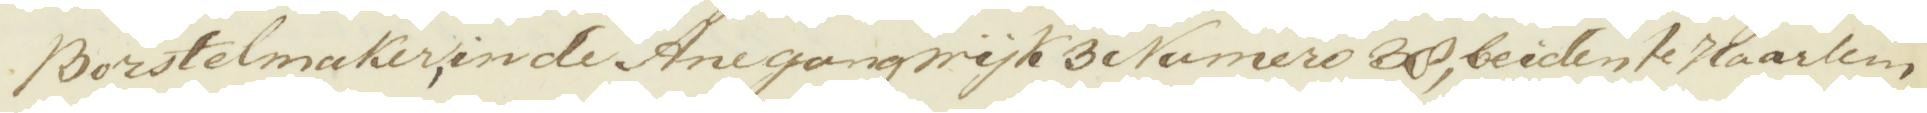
Borstelmaker, in de Anegang wijk 3 Numero 38, beiden te Haarlem
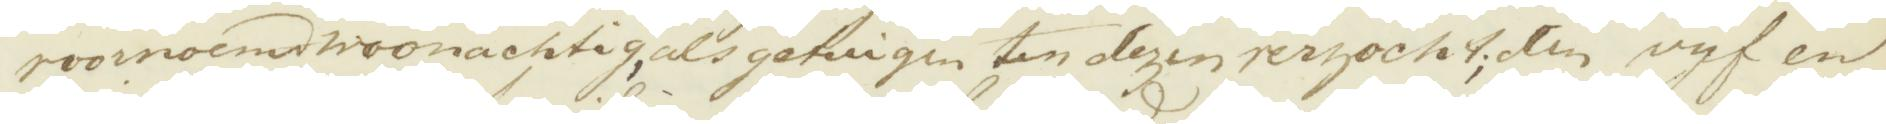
voornoemd woonachtig, als getuigen ten dezen verzocht; den vyf en
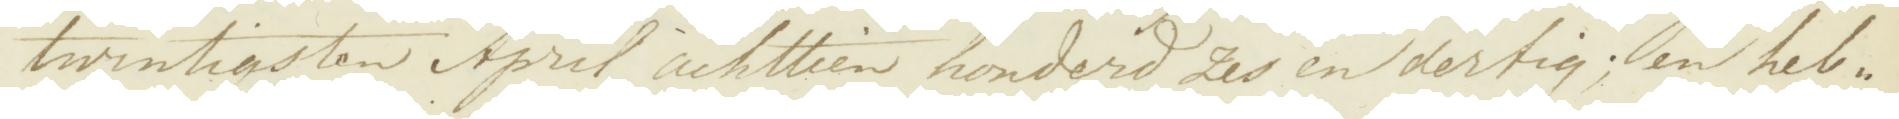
twintigsten April achttien honderd zes en dertig; en heb„
